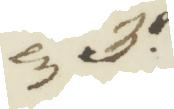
En 3.e
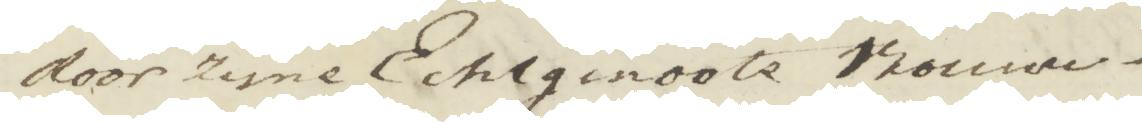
door zyne Echtgenoote Vrouwe -
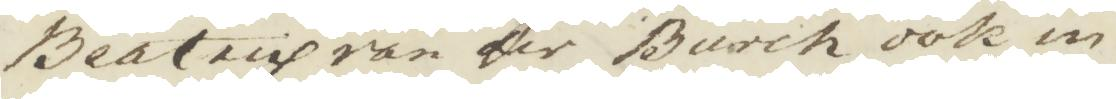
Beatrix van der Burch ook in
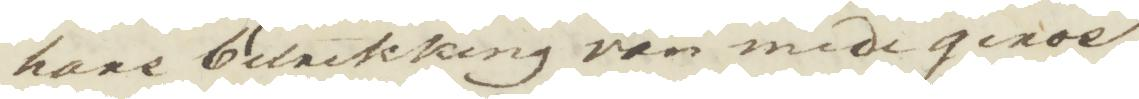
hare betrekking van mede geroe
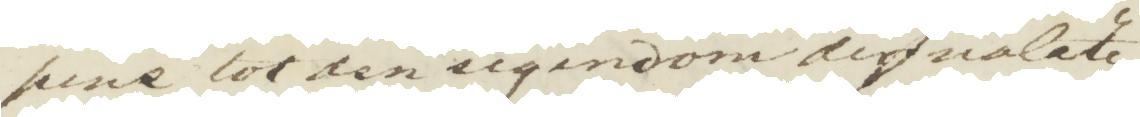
pene tot den eigendom der nalaten
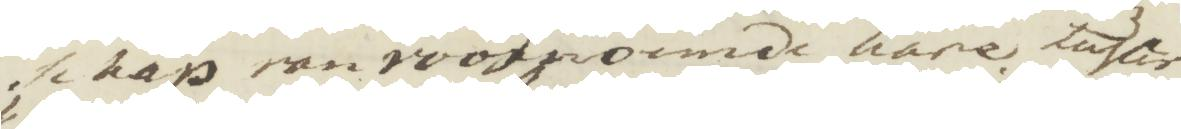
schap van voornoemde hare zuster
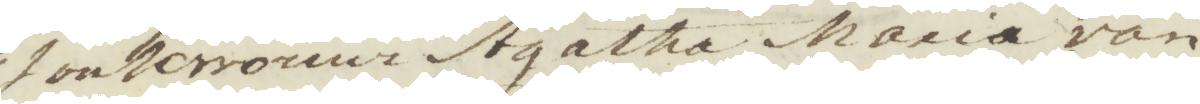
Jonkvrouwe Agatha Maria van
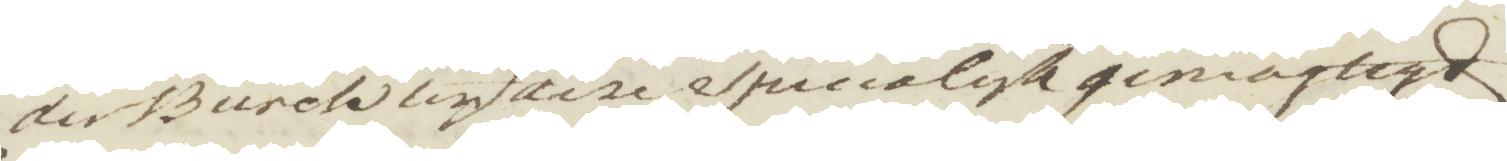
der Burch ten deze specialyk gemagtigd
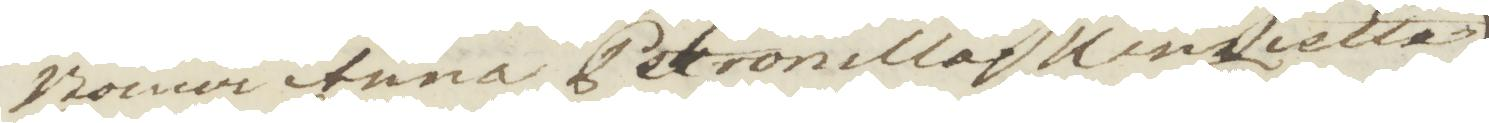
Vrouwe Anna Petronella Henriette
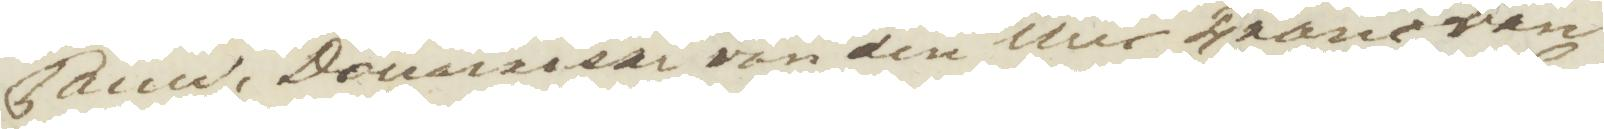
Pauw, Douarriere van den Heer Frans van
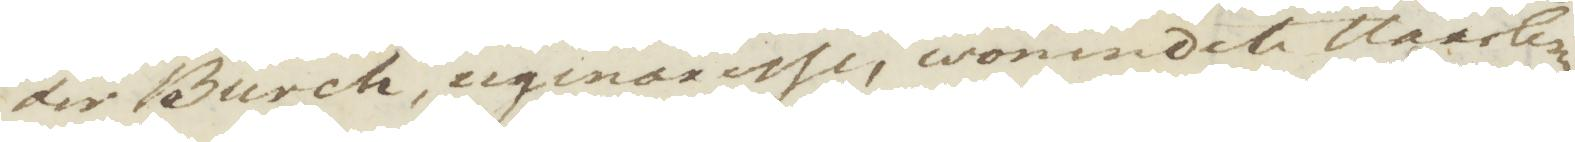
der Burch, eigenaresse, wonende te Haarlem
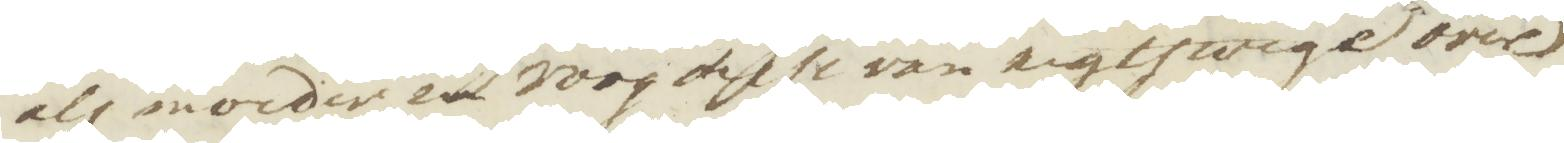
als moeder en voogdesse van regtswege over
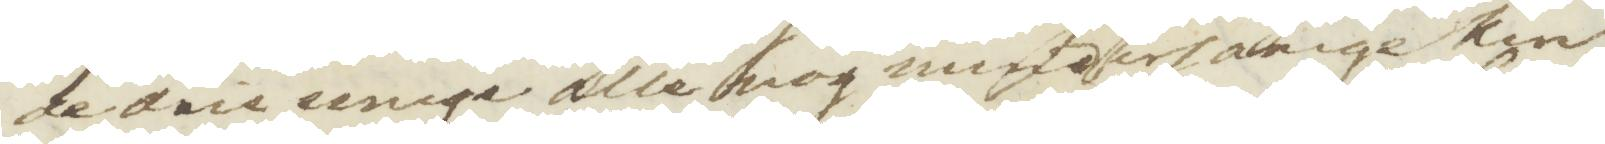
de drie eenige alle nog minderjarige kin
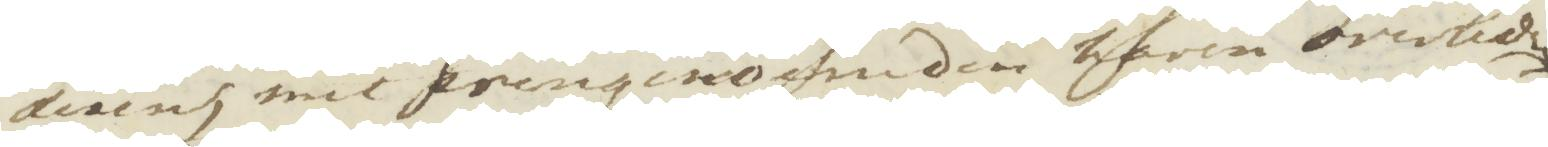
deren, met bovengenoemden haren overleden
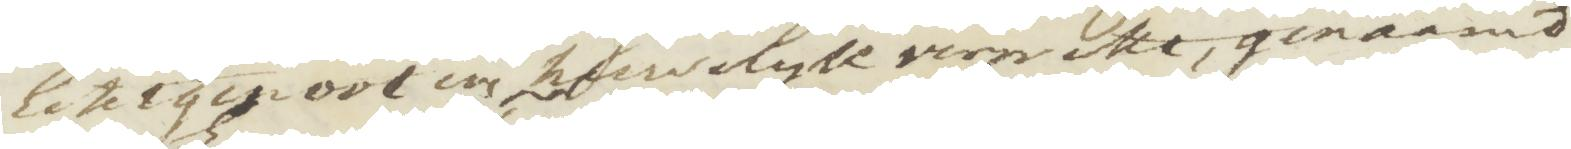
Echtgenoot in huwelyk verwekte, genaamd
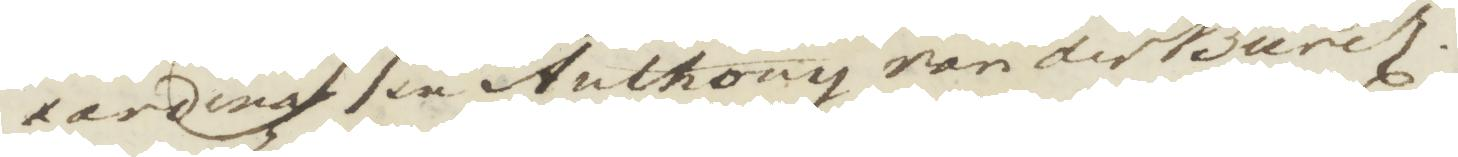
rardina / en Anthony van der Burch.
